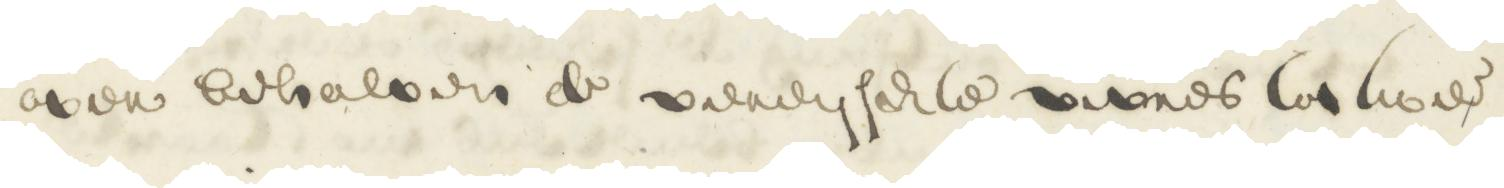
over behalven de vereijschte vivres tot twee,
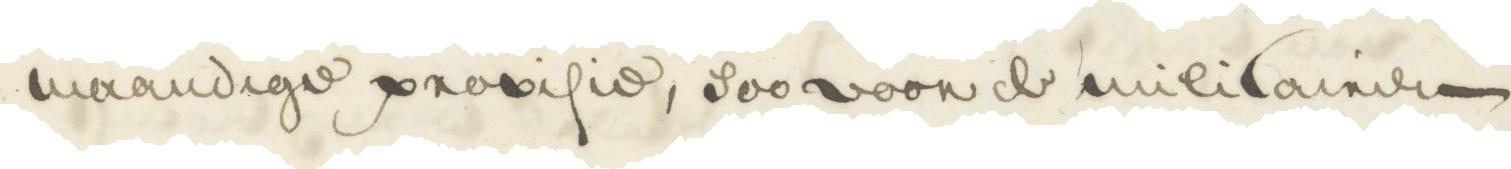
maandige provisie, soo voor de militairen
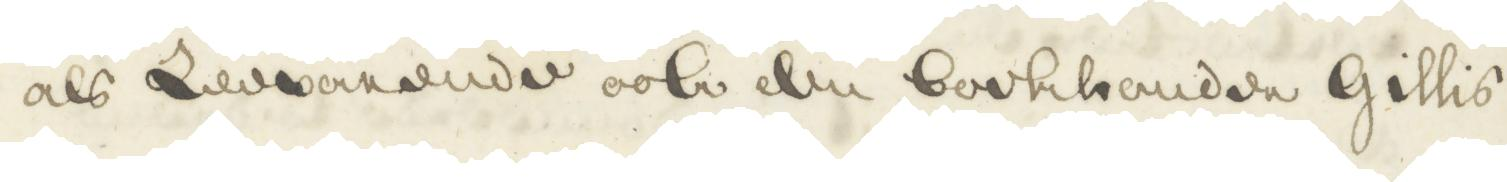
als zeevarende ook den boekhouder gillis
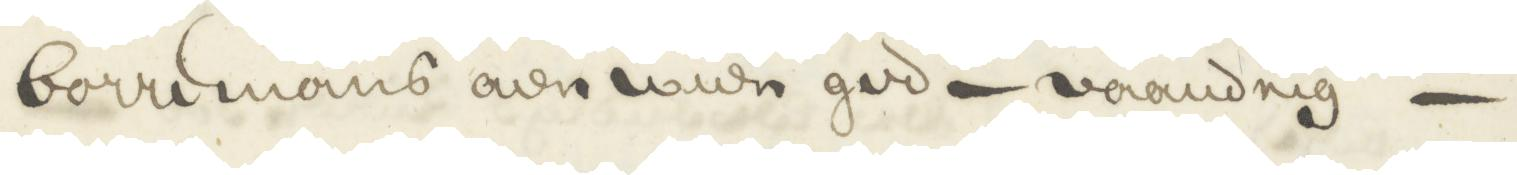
borremans aen wien ged=te vaandrig —
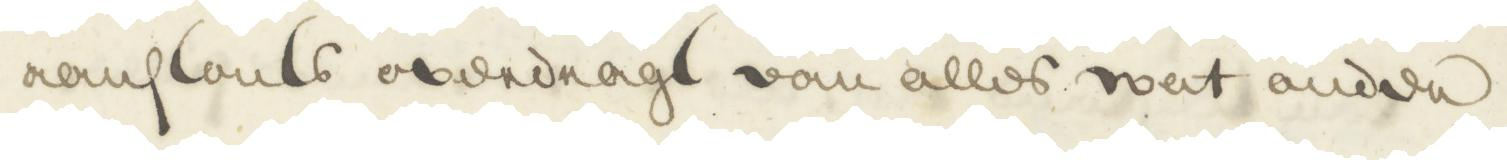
aanstonts overdragt van alles wat onder
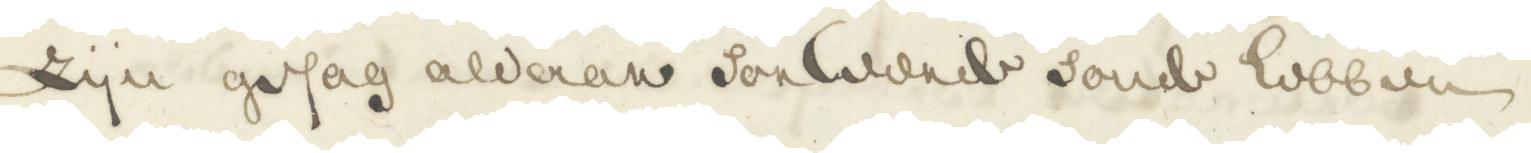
zijn gesag aldaar sorteerde soude hebben
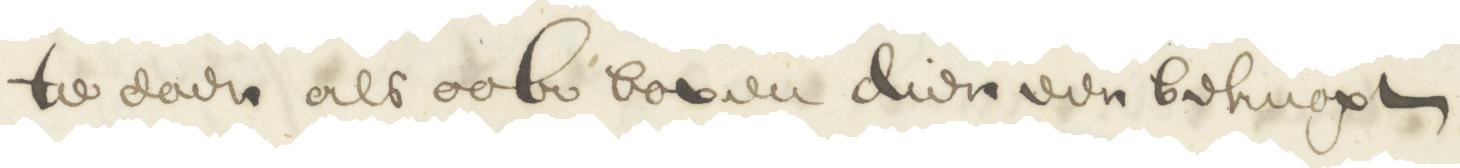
te daer als ook boven dien een beknopt
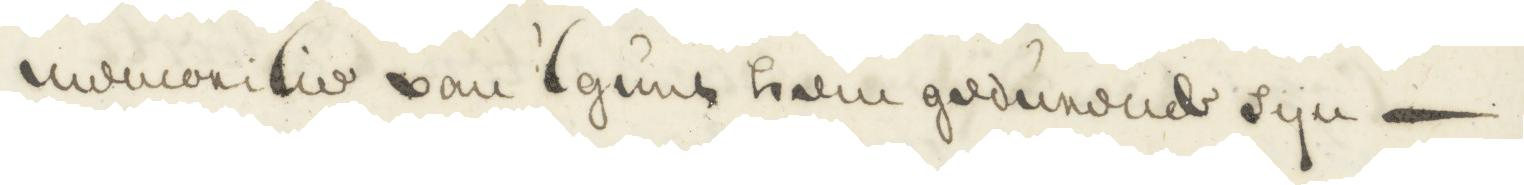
memoritie van ’t gunt hem gedurende sijn —
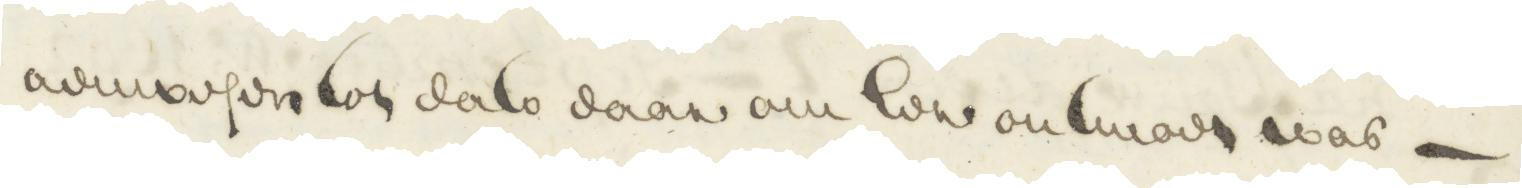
aenwesen tot dato daar om her ontmoet was —
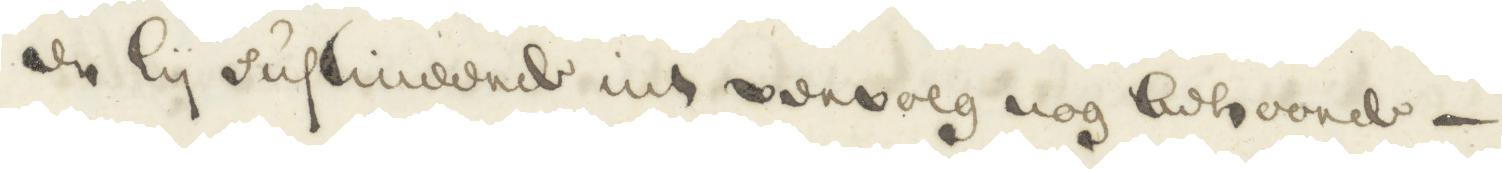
en hij sustineerde int vervolg nog behoorde —
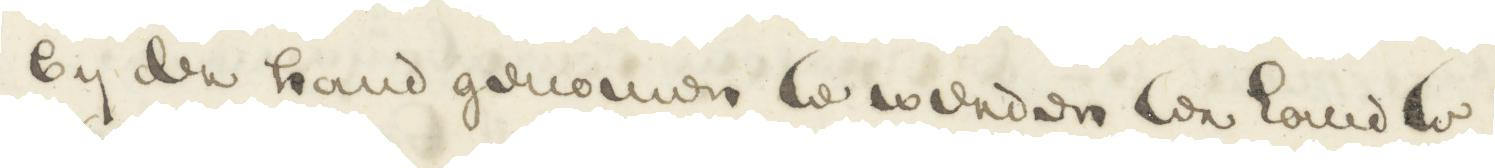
bij der hand genomen te werden ter hand te
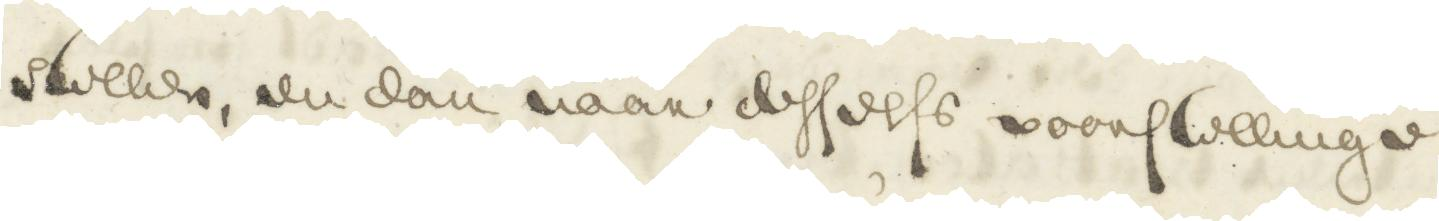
stellen, en dan naar desselfs voorstellinge
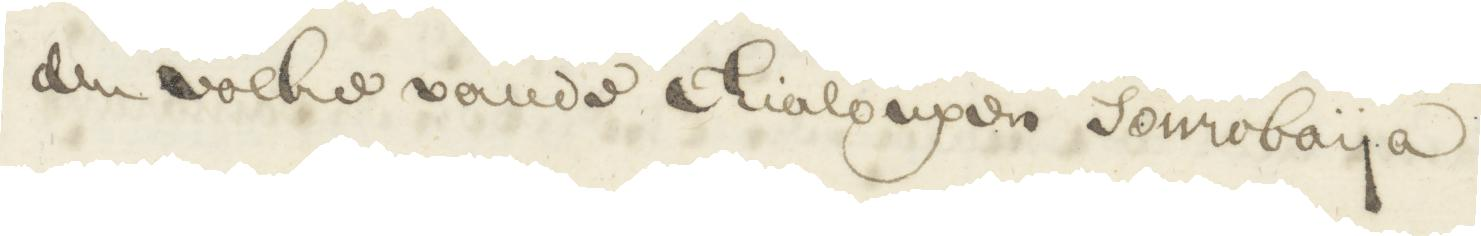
den volke vande Chialoupen sourobaija
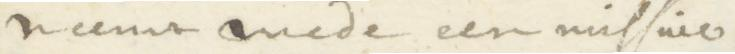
neemt mede een missive
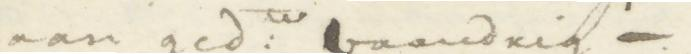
aan ged:te vaandrig —
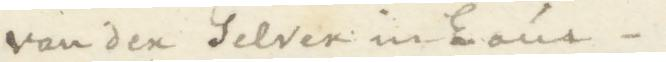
van der selver inhout.
